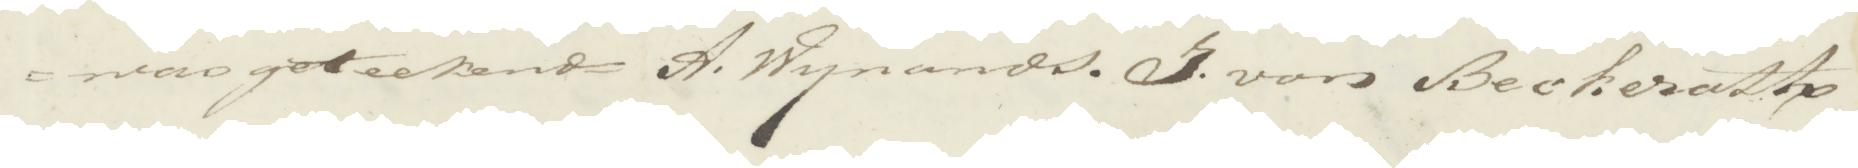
=was geteekend= A. Wynands. J. van Beckerath
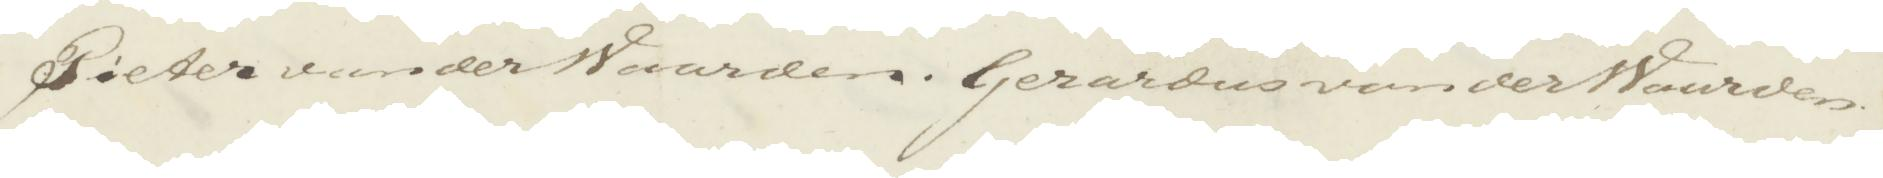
Pieter van der Waarden. Gerardus van der Waarden.
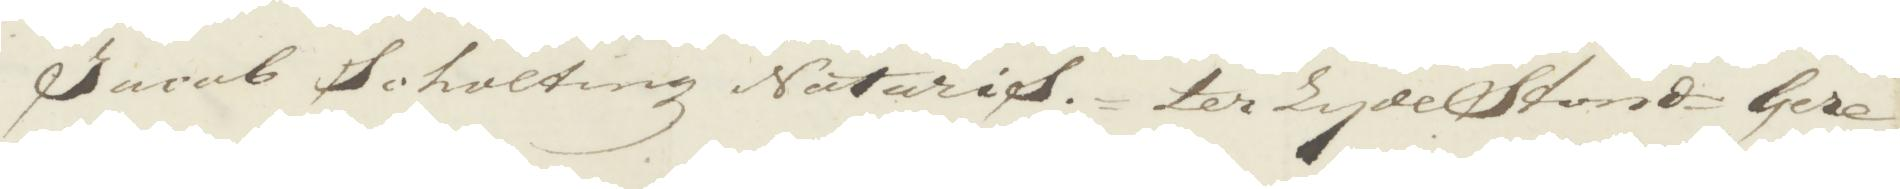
Jacob Scholting Notaris. - ter zyde stond= Gere
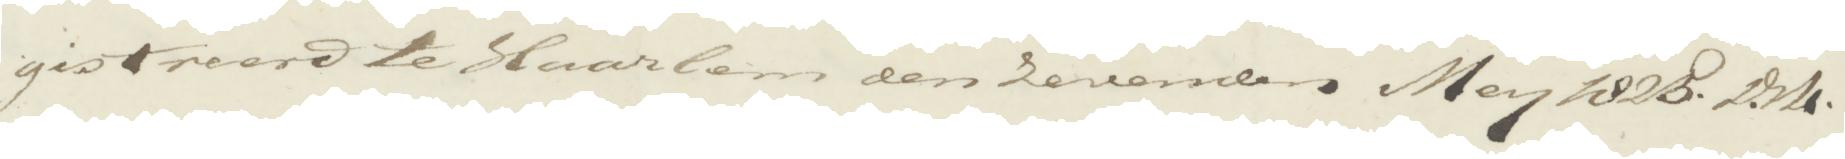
gistreerd te Haarlem den zevenden Mey 1823. D.4.
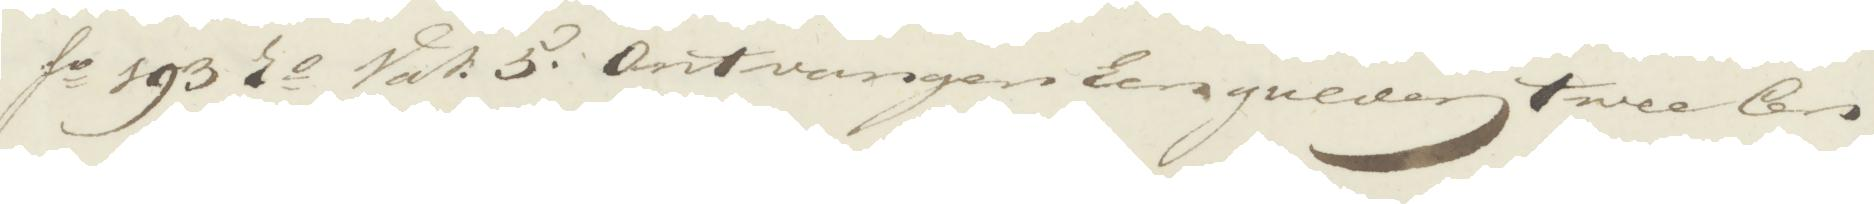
f=o 193 r=o Vak 5: Ontvangen Een gulden twee Cen
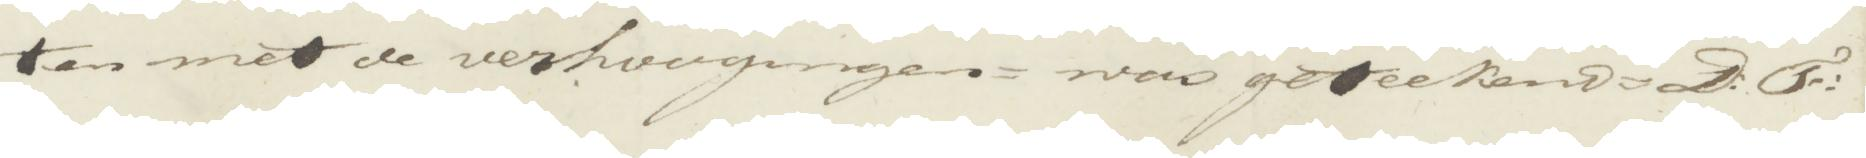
ten met de verhoogingen = was geteekend= D: F:
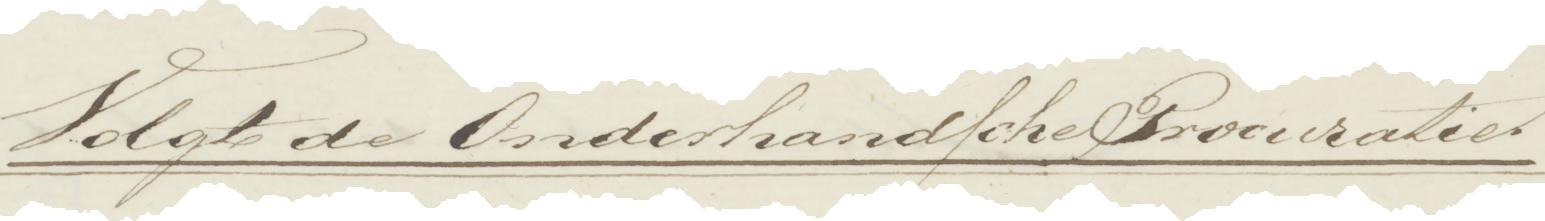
Volgt de Onderhandsche Procuratie.
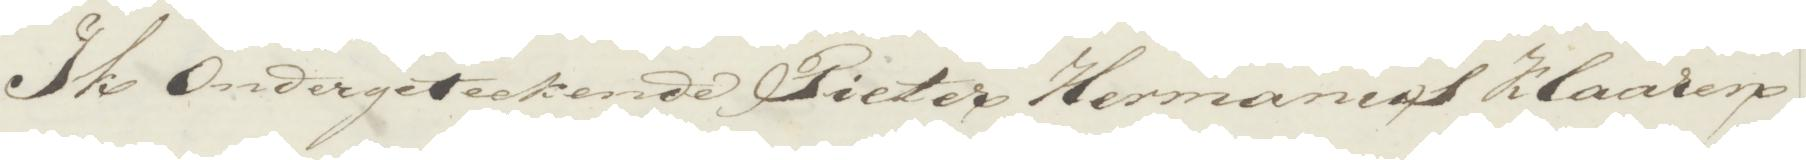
Ik Ondergeteekende Pieter Hermanius Klaaren
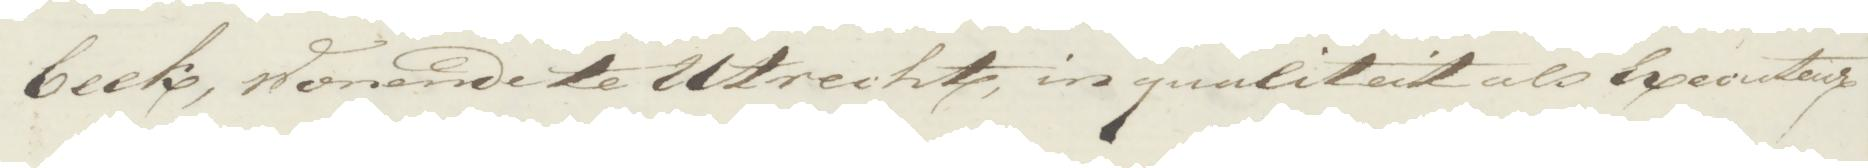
beek, wonende te Utrecht, in qualiteit als Executeur
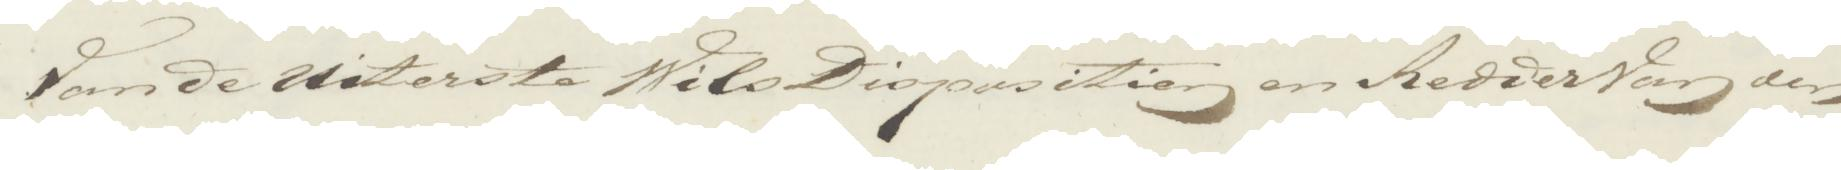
Van de uiterste Wils Dispositien en Redder van den
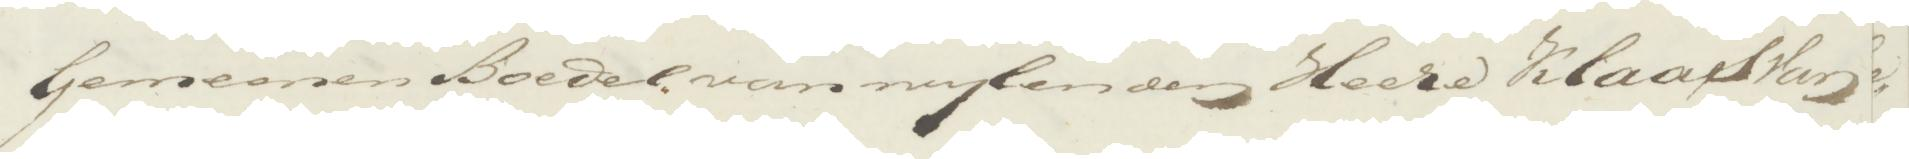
Gemeenen Boedel van wylen den Heere Klaas van
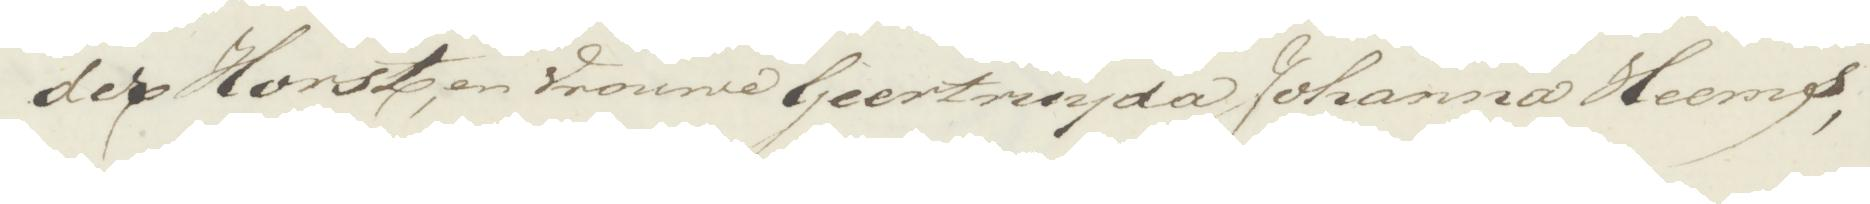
der Horst, en Vrouwe Geertruyda Johanna Heems,
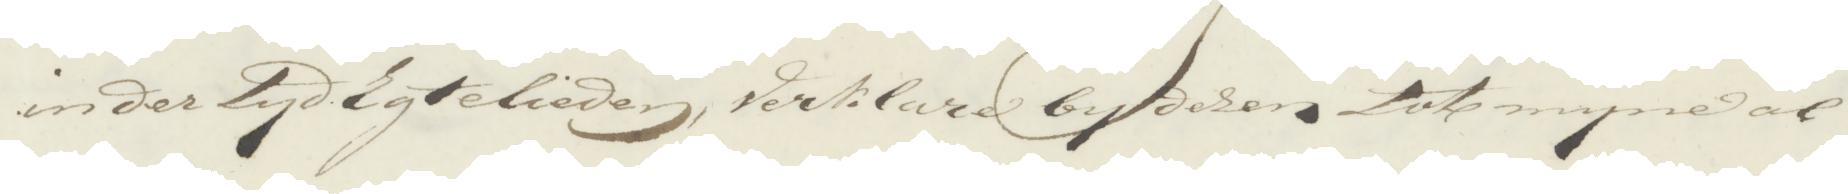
in der tyd Egtelieden, verklare by dezen tot myne al
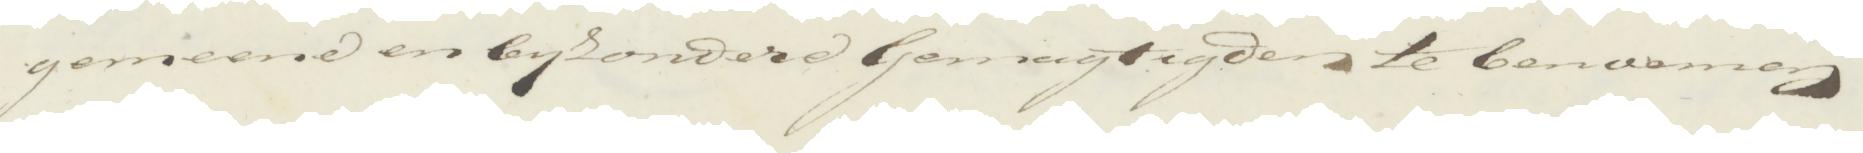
gemeene en byzondere Gemagtigden te benoemen
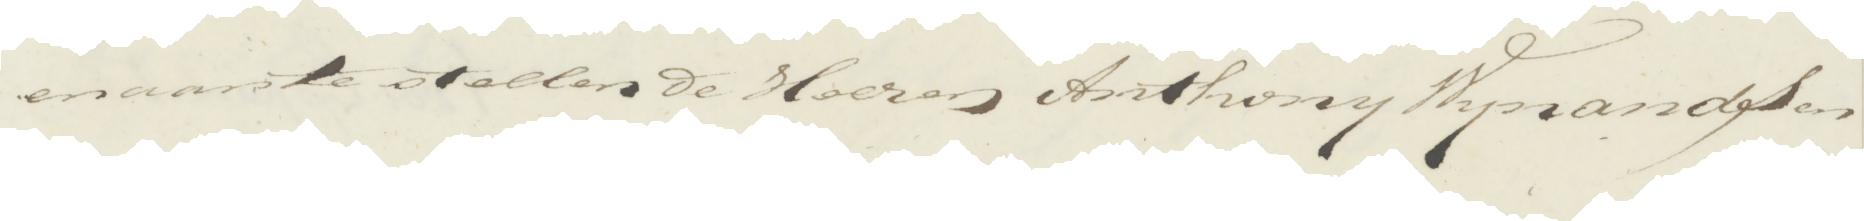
en aan te stellen de Heeren Anthony Wynands en
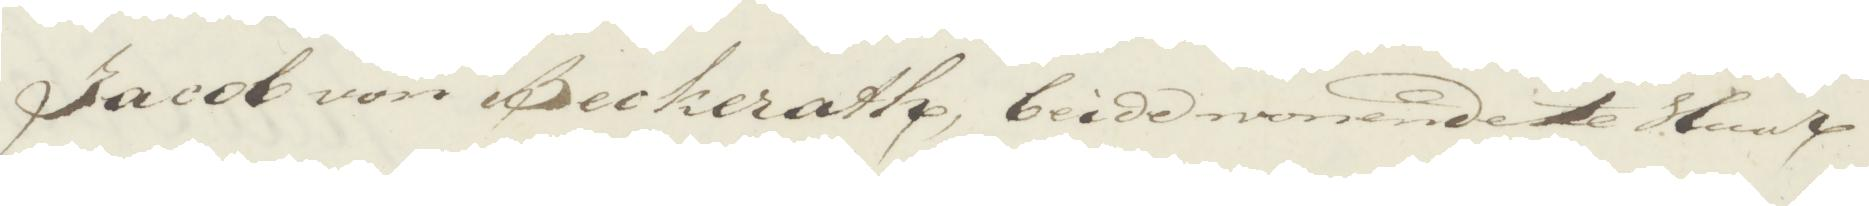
Jacob van Beckerath, beide wonende te Haar
